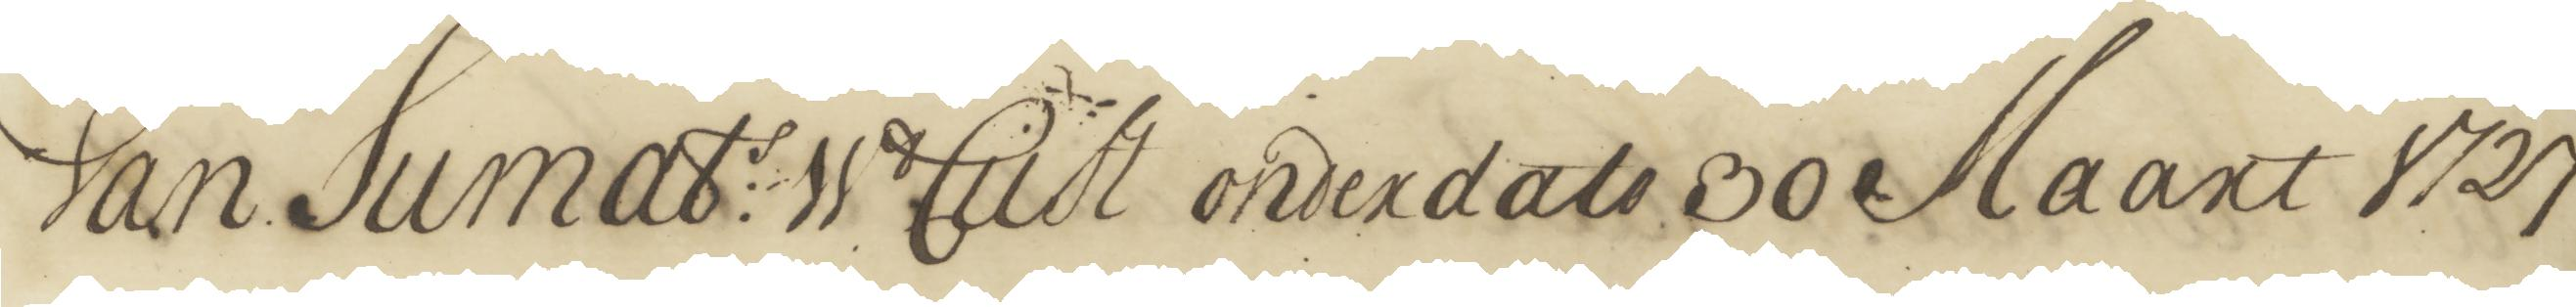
Van Sumat:s Wt Cust onder dato 30 Maart 1727
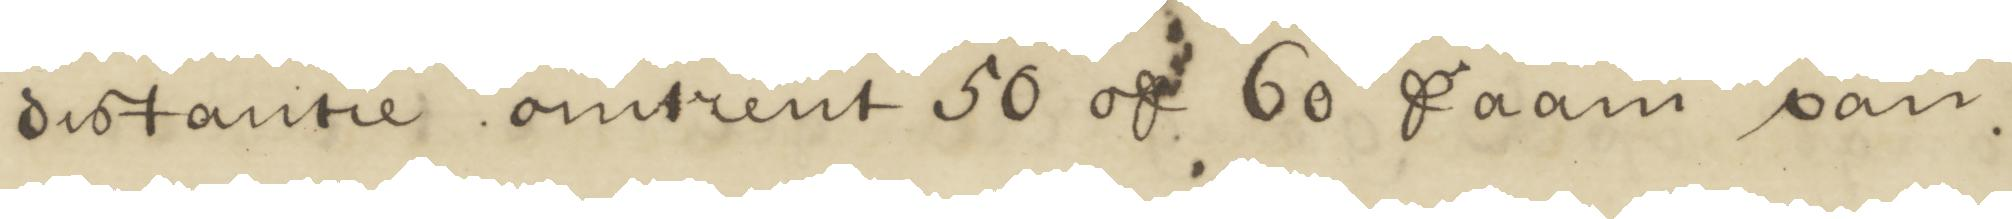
distantie omtrent 50 of 60 faam van
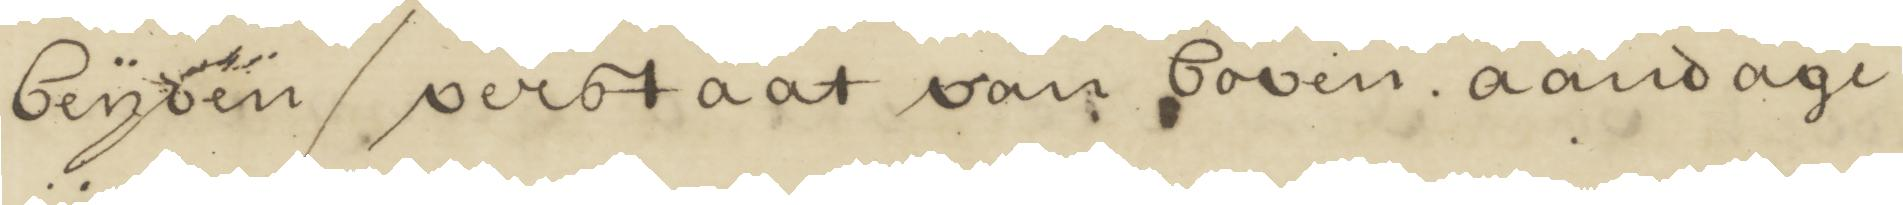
beijden / verstaat van boven aandage
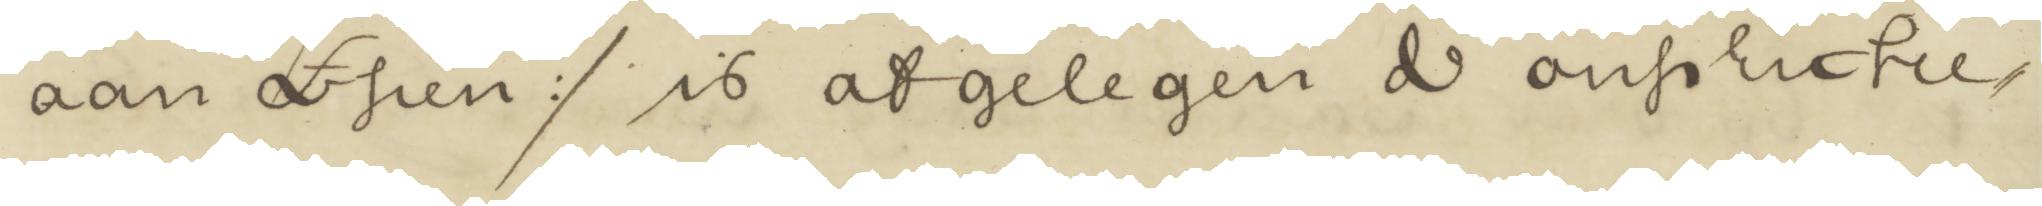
aan tesien :/ is afgelegen de onschicke„
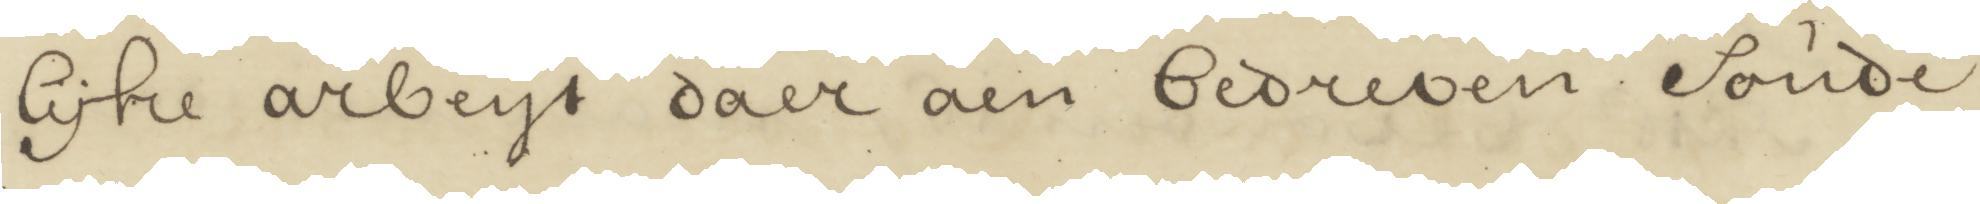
lijke arbeijt daer aen bedreven soude
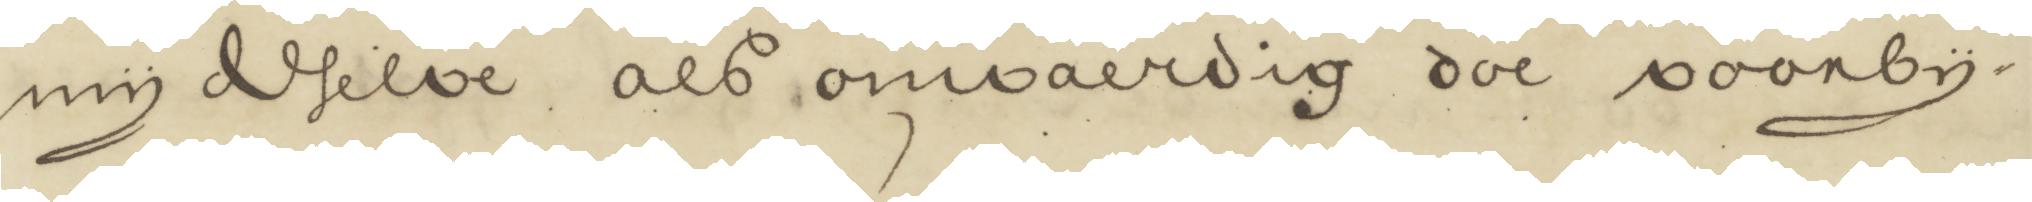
mij deselve, als onwaerdig doe voorbij„
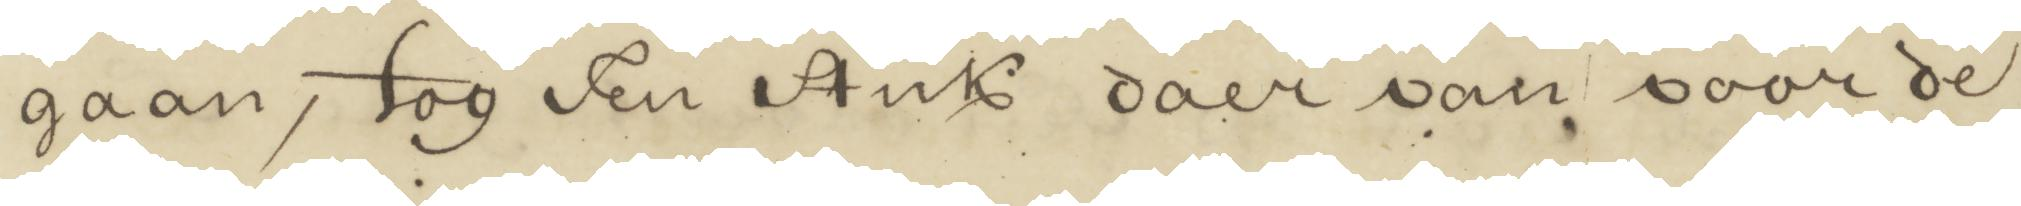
gaan, tog Een stuk daer van voor de
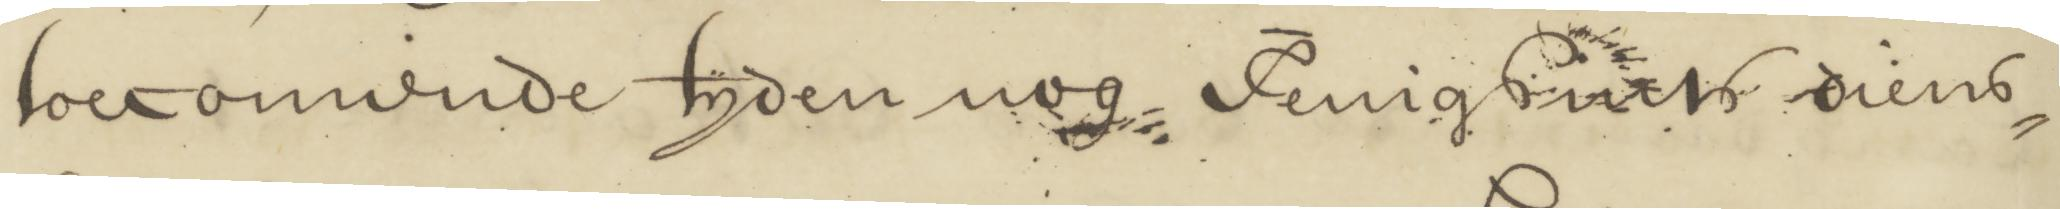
toecomende tijden nog Eenigsints diens„
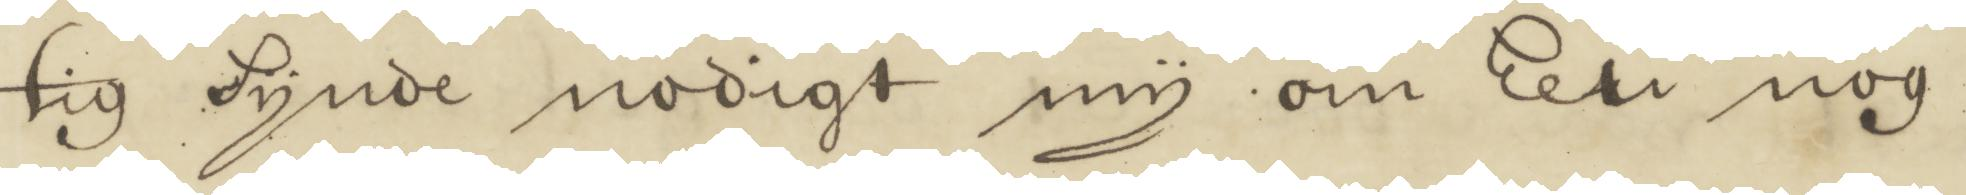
tig sijnde nodigt mij om het nog
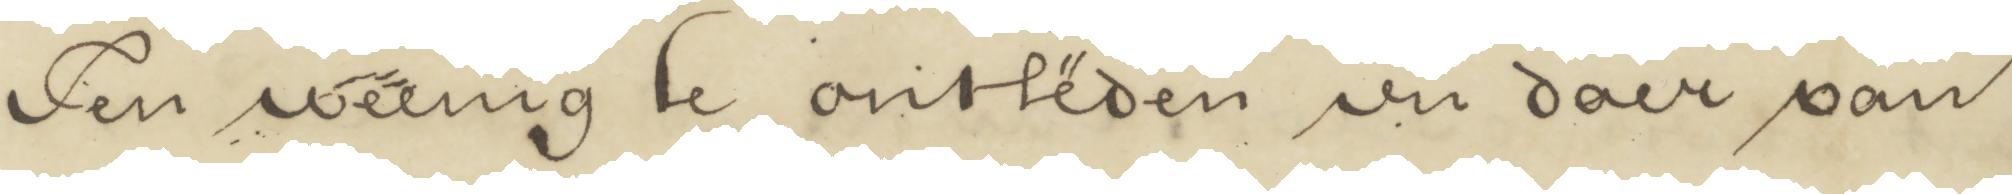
Een weenig te ontleden en daer van
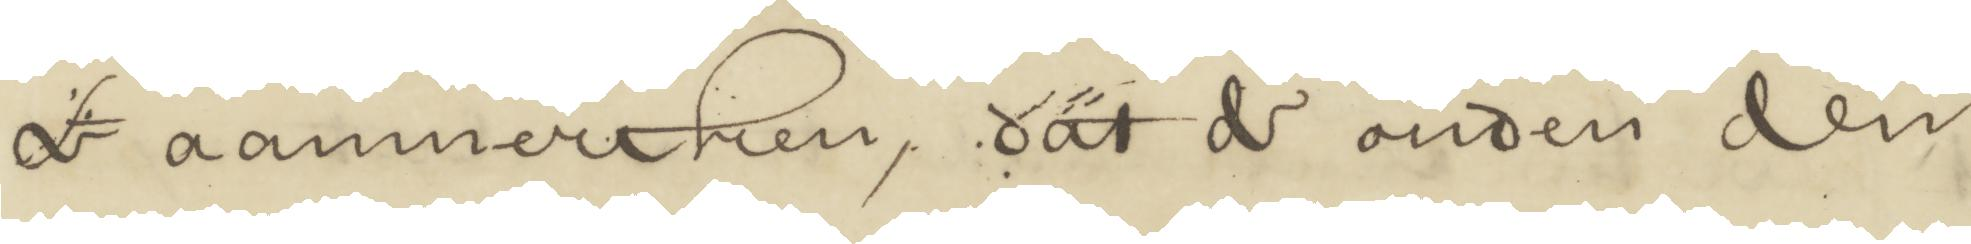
te aanmercken, dat de ouden den
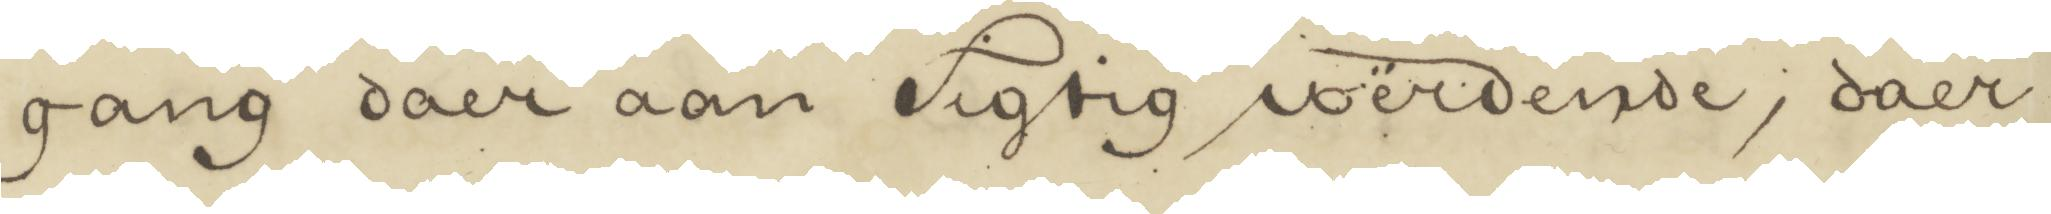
gang daer aan sigtig werdende; daer
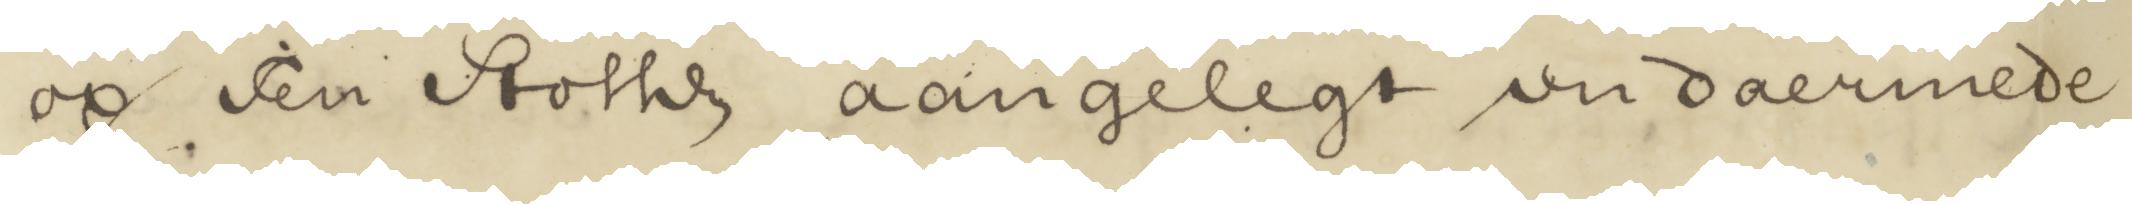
op, een stollen aangelegt en daermede
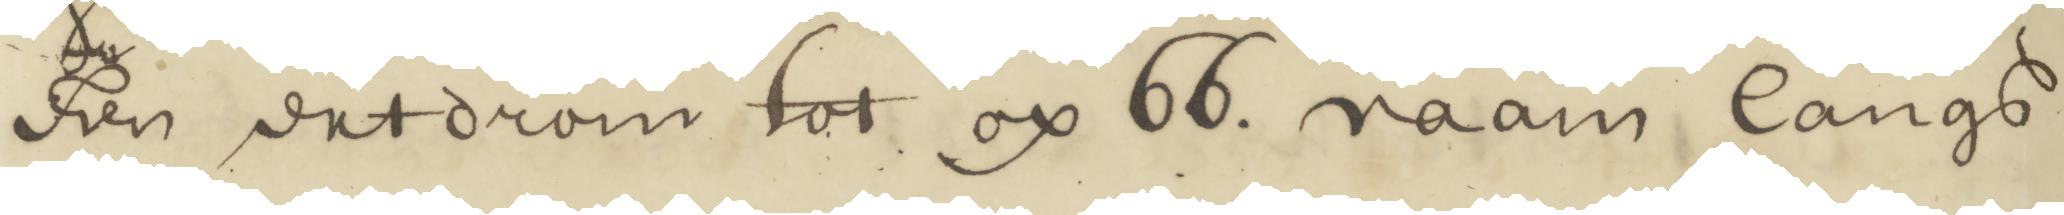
een ertdrom tot op 66. vaam langs
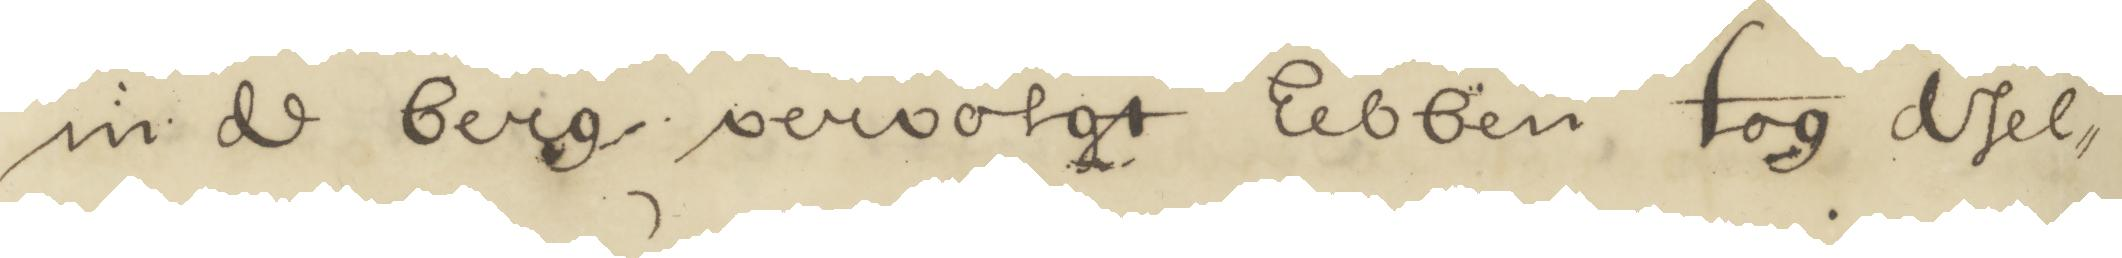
in de berg vervolgt hebben tog desel„
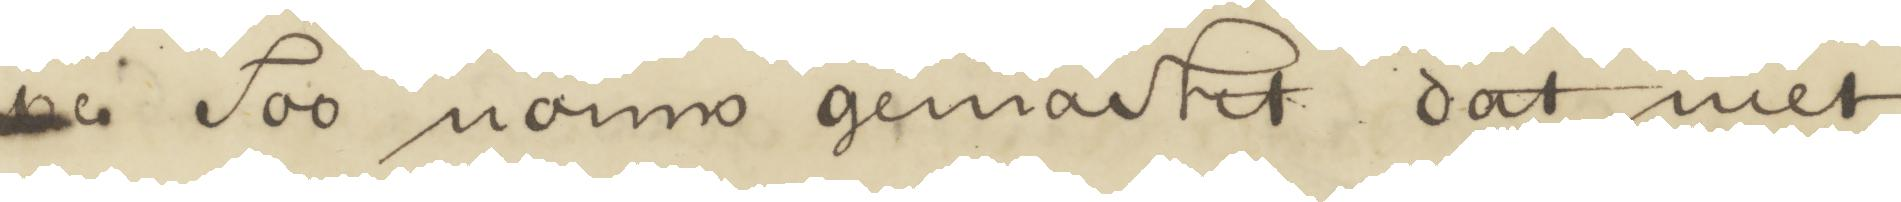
ve soo nouw gemaekt, dat niet
